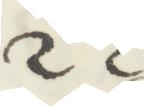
22.e
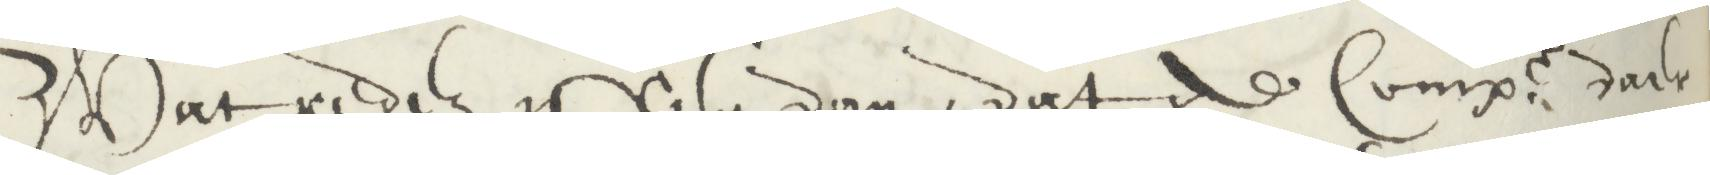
Wat reden isser dan, dat de Comp.e daer
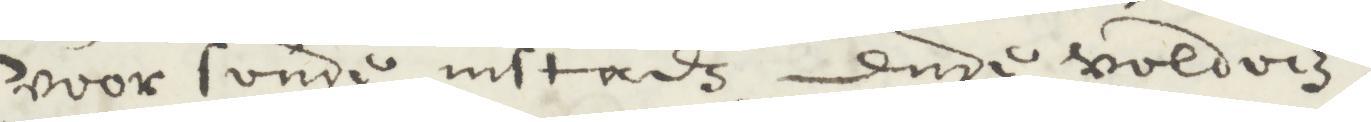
voor soude instaen ende voldoen
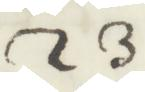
23=e
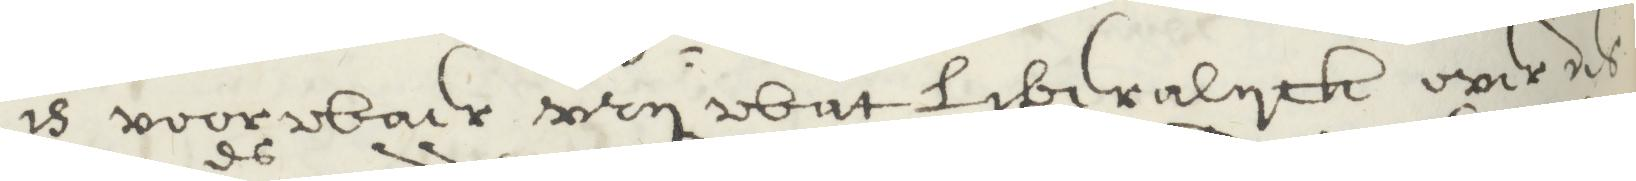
is voorwaer vry wat Liberalyck over des
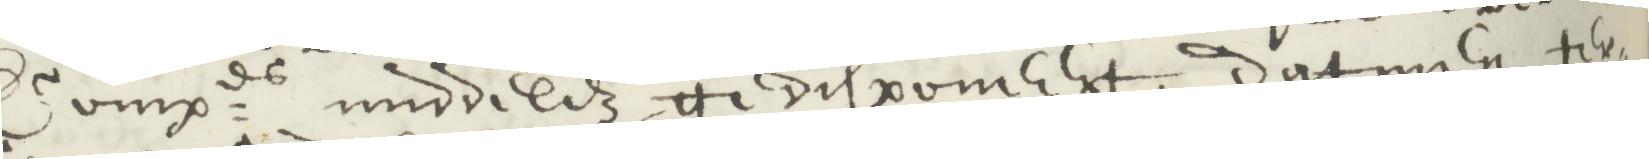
Comp=es middelen gedisponeert, dat men ter„
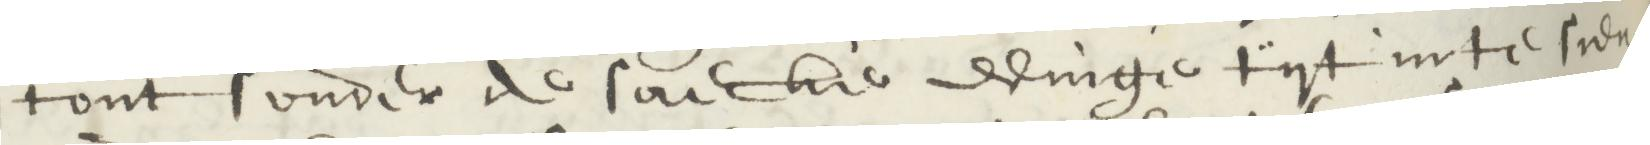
stont sonder de saecke eenige tijt in te sien,
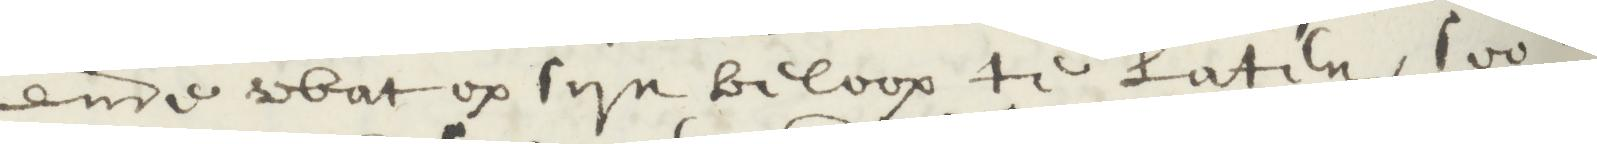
ende wat op syn beloop te laten, soo -
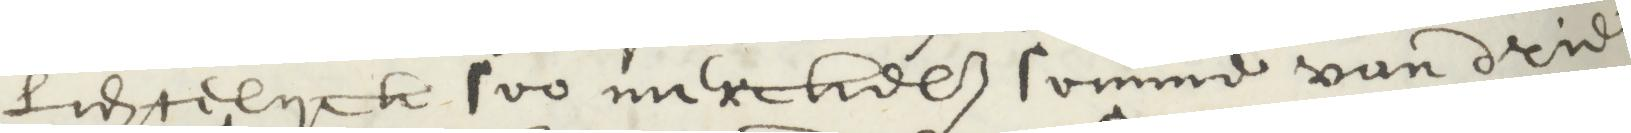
lichtelyck soo merckelijk somme van drie
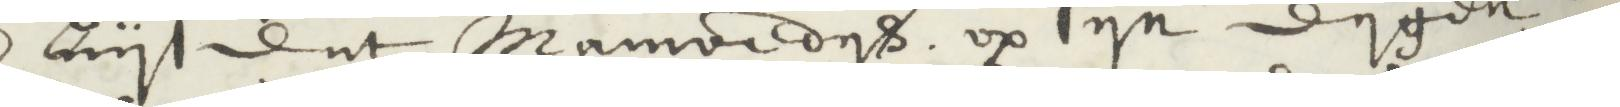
duijsent Mamoedys. op syn eygen -
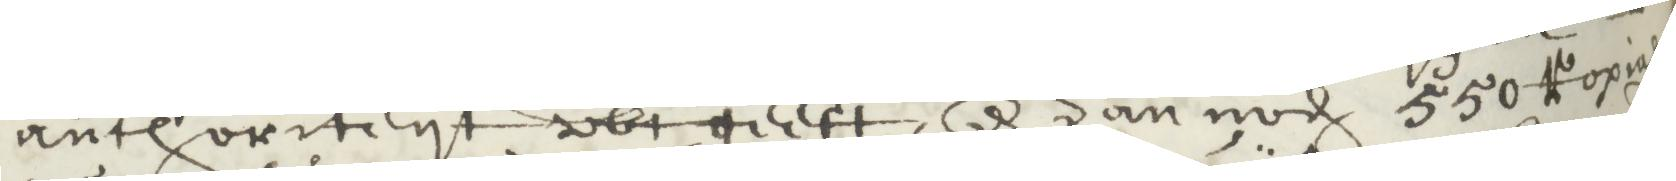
authoriteyt wt geeft, ende van noch 550 ropias
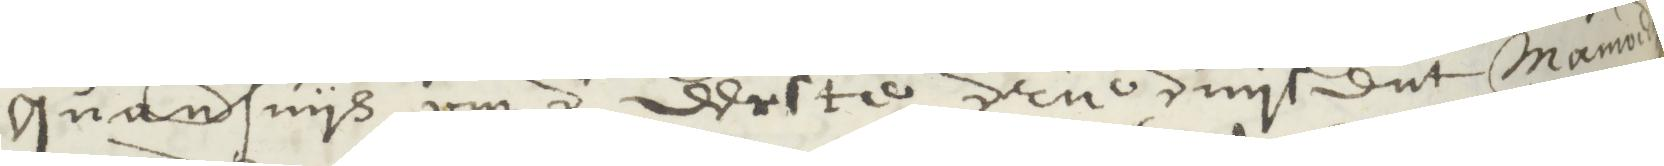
quansuijs om d' eerste drie duijsent Mamoe
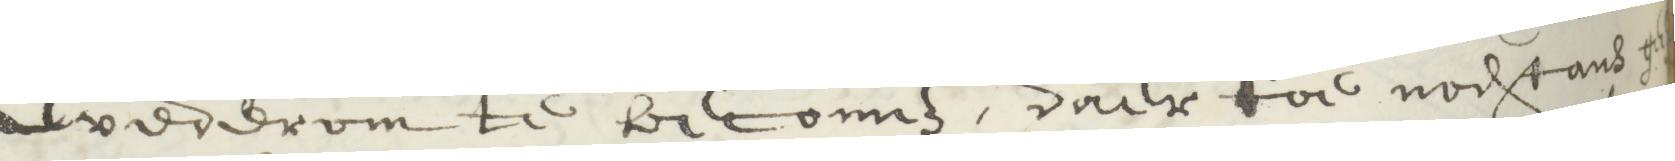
wederom te becomen, daer toe nochtans g
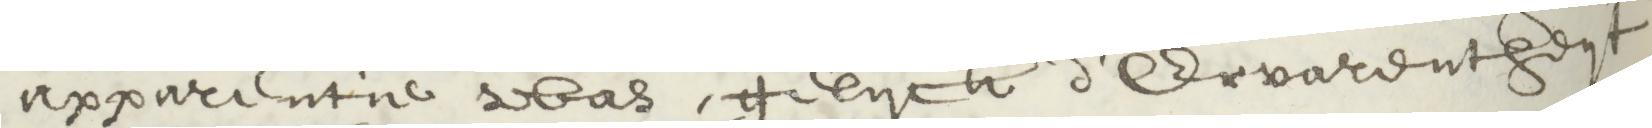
apparentie was, gelyck d’Ervarentheyt
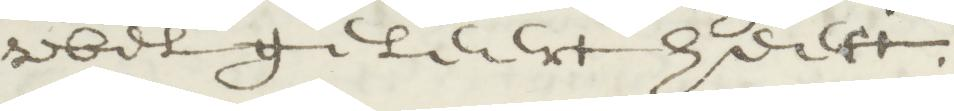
wel geleert heeft.
